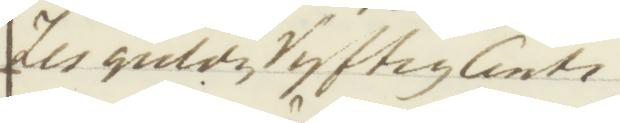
Zes gulden Vyftig Cents
